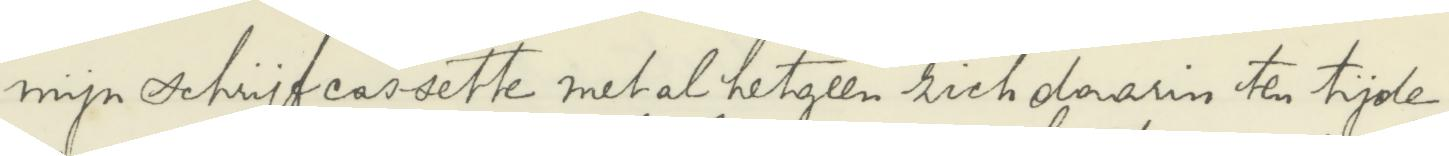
mijn schrijfcassette met al het geen zich daarin ten tijde
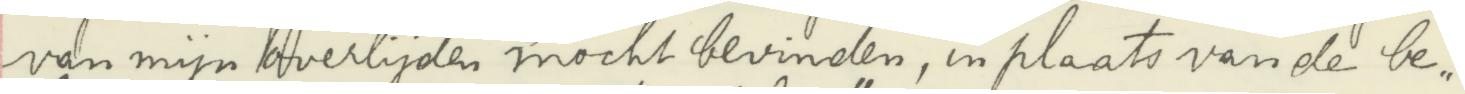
van mijn overlijden mocht bevinden, in plaats van de be„
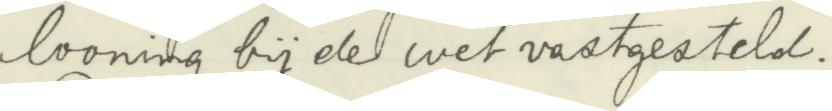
looning bij de wet vastgesteld.
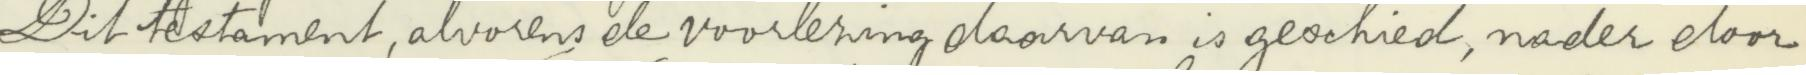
Dit testament, alvorens de voorlezing daarvan is geschied, nader door
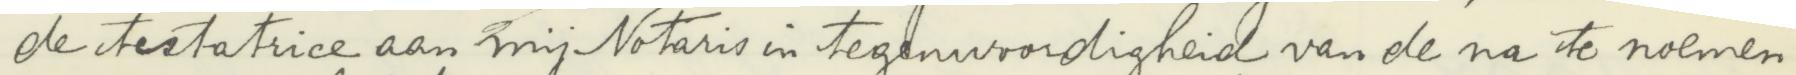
de testatrice aan mij Notaris in tegenwoordigheid van de na te noemen
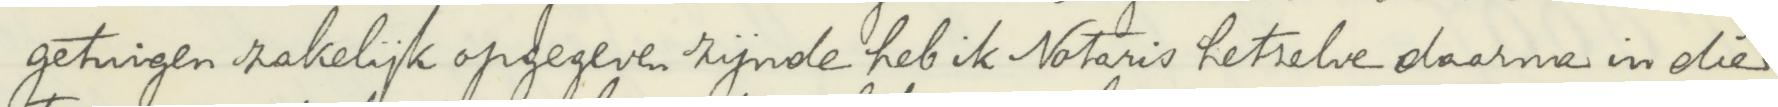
getuigen zakelijk opgegeven zijnde heb ik Notaris hetzelve daarna in die
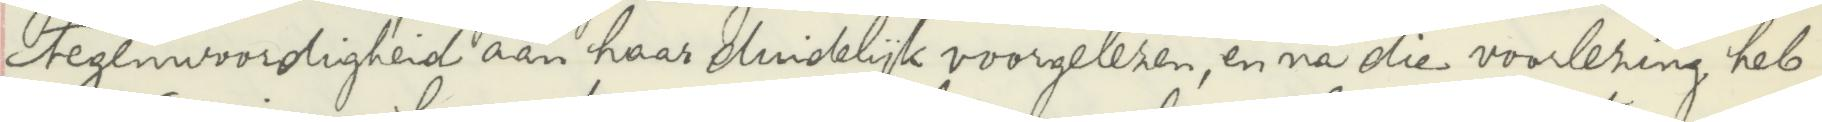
tegenwoordigheid aan haar duidelijk voorgelezen, en na die voorlezing heb
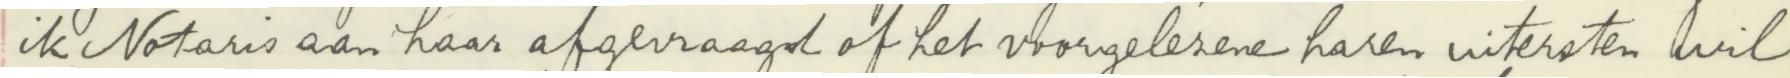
ik Notaris aan haar afgevraagd of het voorgelezene haren uitersten wil
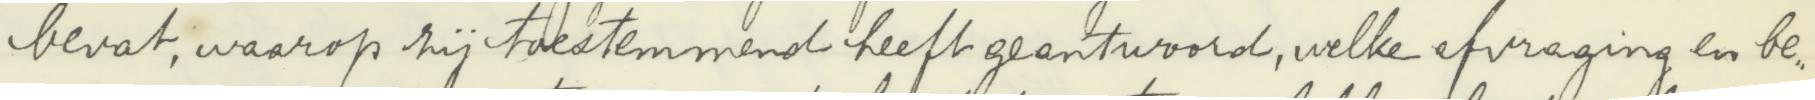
bevat, waarop zij toestemmend heeft geantwoord, welke afvraging en be„
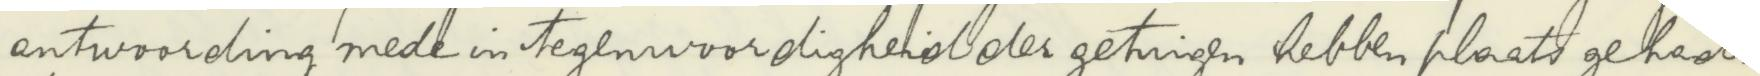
antwoording mede in tegenwoordigheid der getuigen hebben plaats gehad.
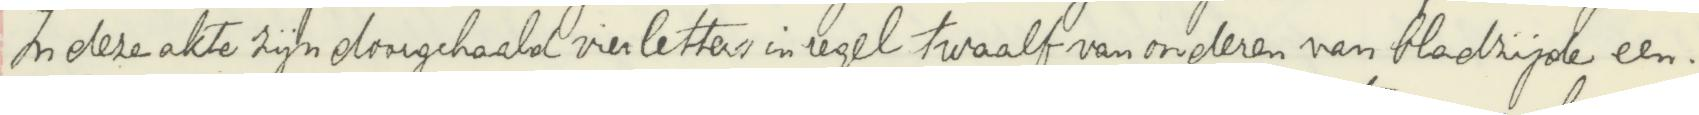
In deze akte zijn doorgehaald vier letters in regel twaalf van onderen van bladzijde een.
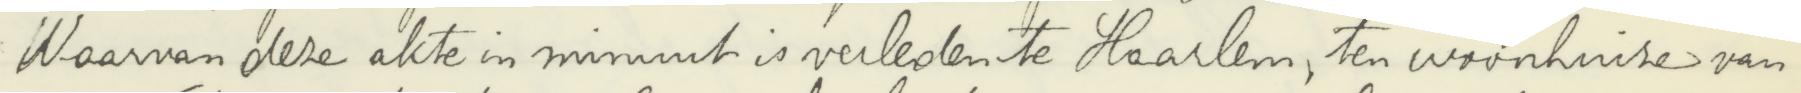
Waarvan deze akte in minuut is verleden te Haarlem, ten woonhuize van
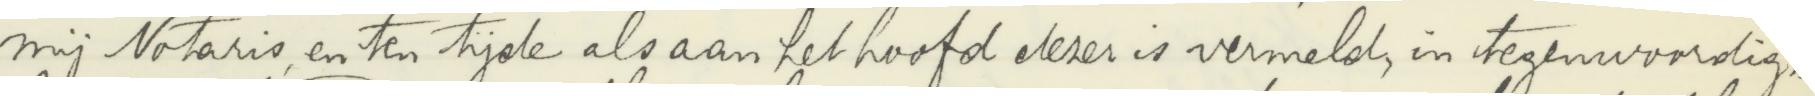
mij Notaris, en ten tijde als aan het hoofd dezer is vermeld, in tegenwoordig„
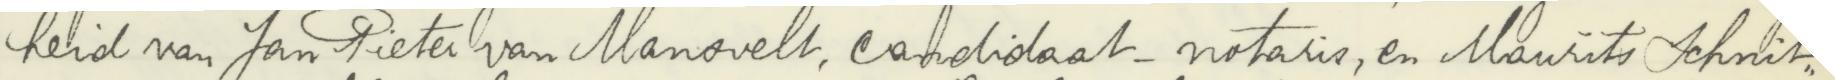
heid van Jan Pieter van Mansvelt, candidaat- notaris, en Maurits Schnit„
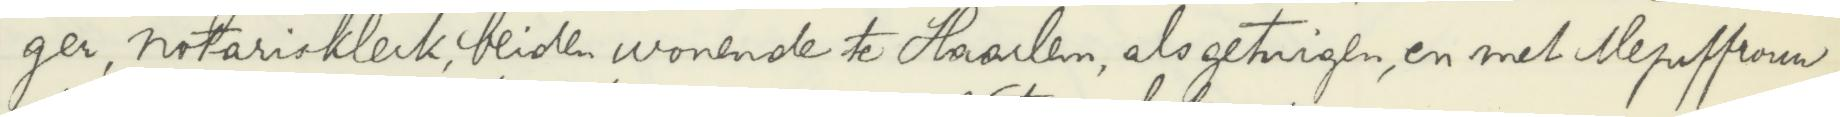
ger, notarisklerk, beiden wonende te Haarlem, als getuigen, en met Mejuffrouw
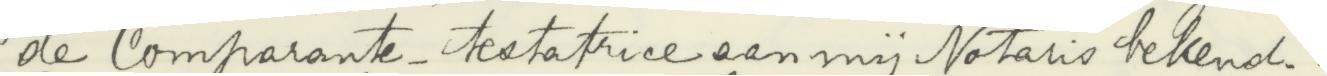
de Comparante-testatrice aan mij Notaris bekend.
